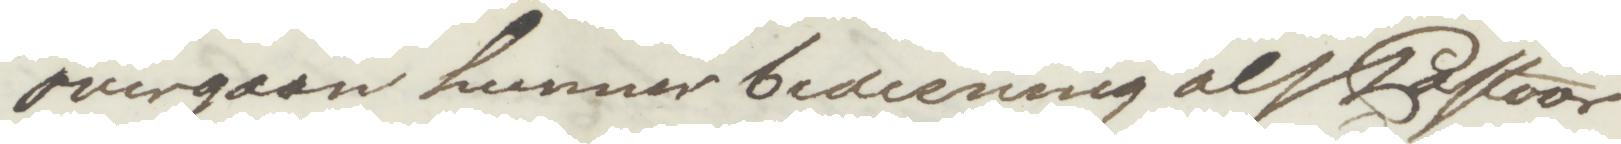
overgaan hunner bediening als Pastoor
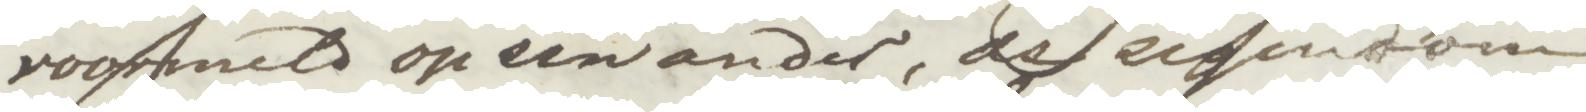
voormeld op een ander, de eigendom
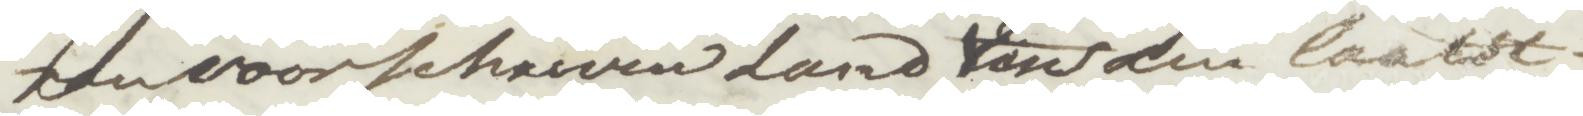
van voorschreven land van den laatst
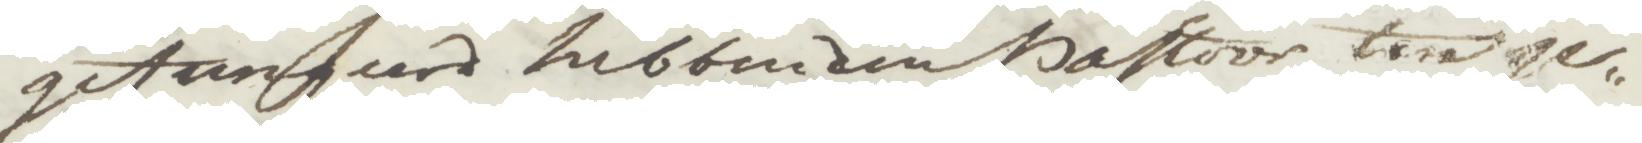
gefungeerd hebbenden Pastoor ten ge„
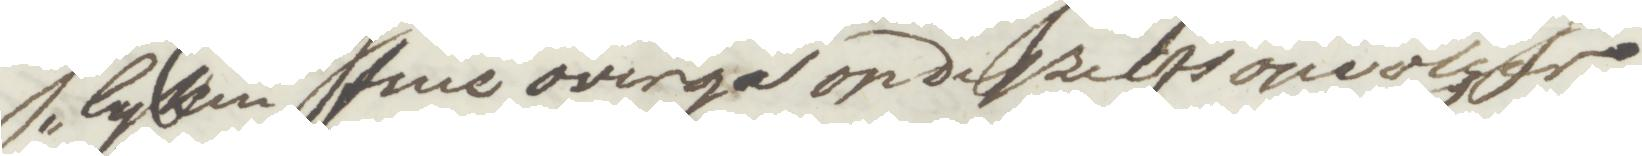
„lyken fine overga op deszelfs opvolger
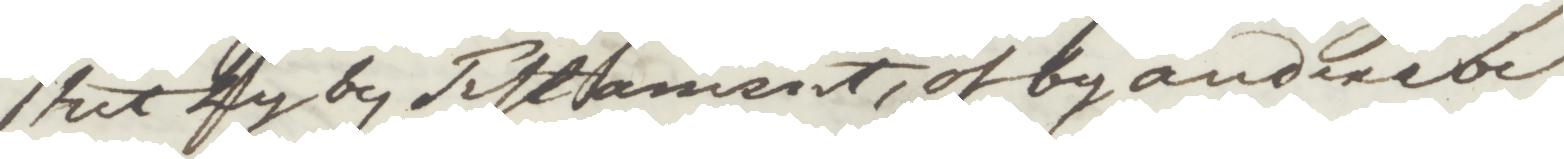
het zy by Testament, of by andere be
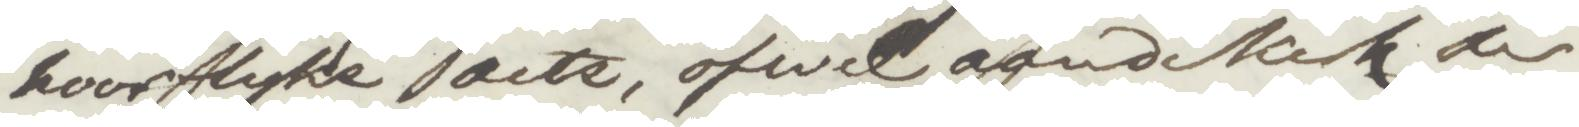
=hoorlyke acte, of wel aan de kerk te
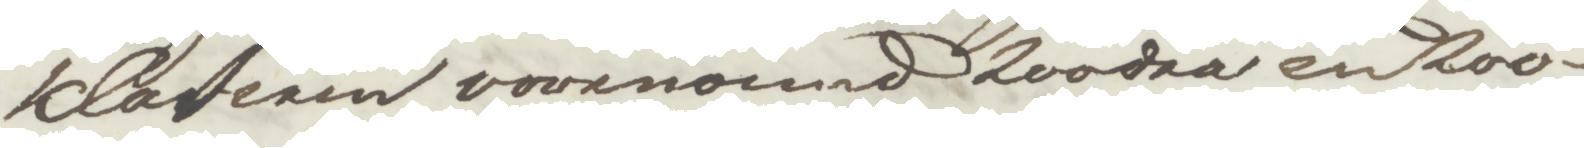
Klaveren voornoemd zoodra en zoo
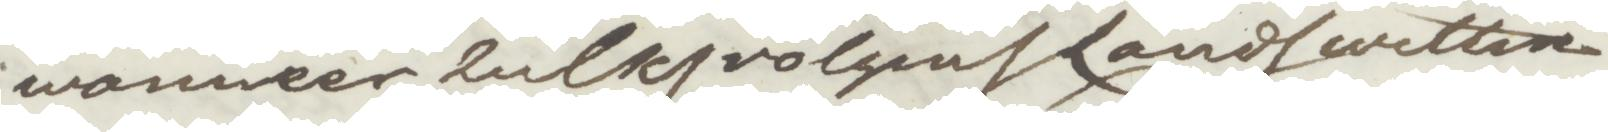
wanneer zulks volgens Landswetten
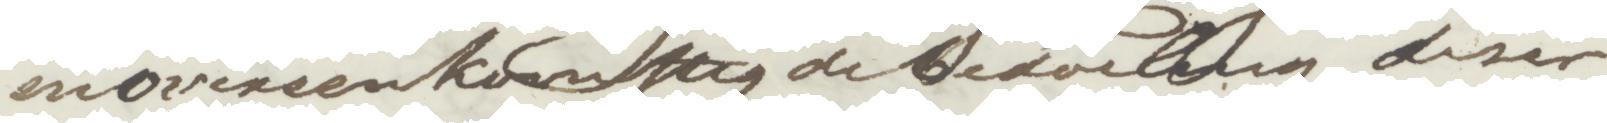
en overeenkomstig de bedoeling dezer
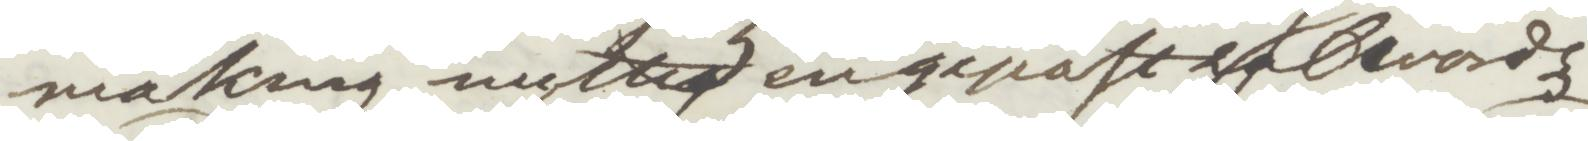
making wettig en gepast zal worden
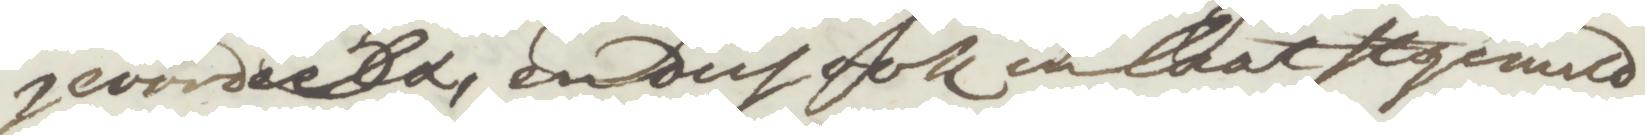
geoordeeld, en dus ook in laatstgemeld
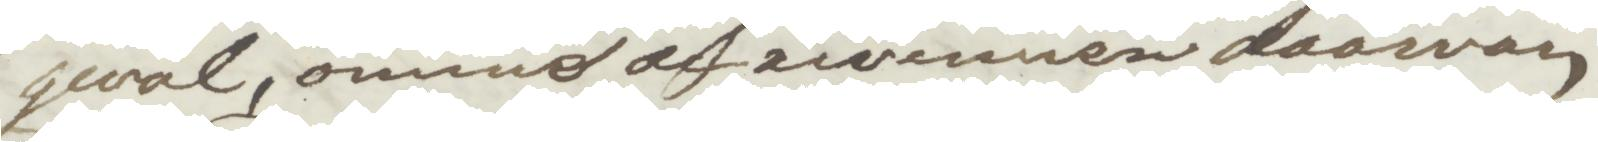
geval, omme de revenuen daarvan
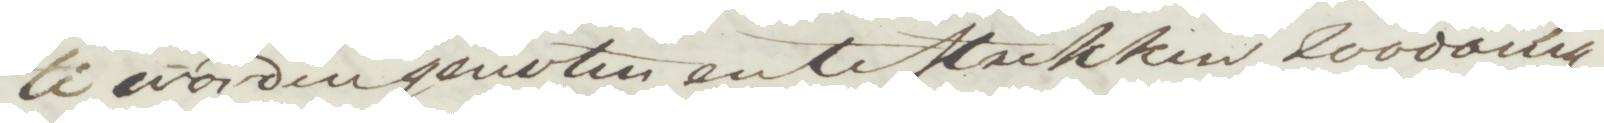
te worden genoten en te strekken zoodanig
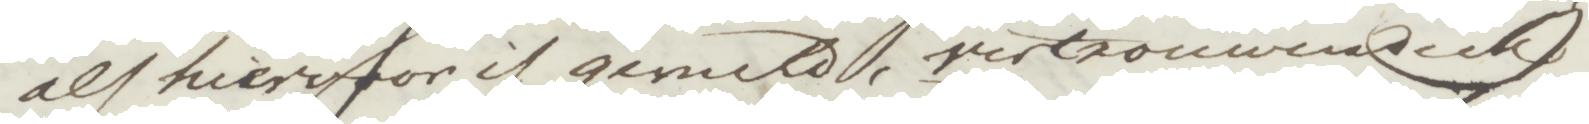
als hiervoor is gemeld, vertrouwende ik
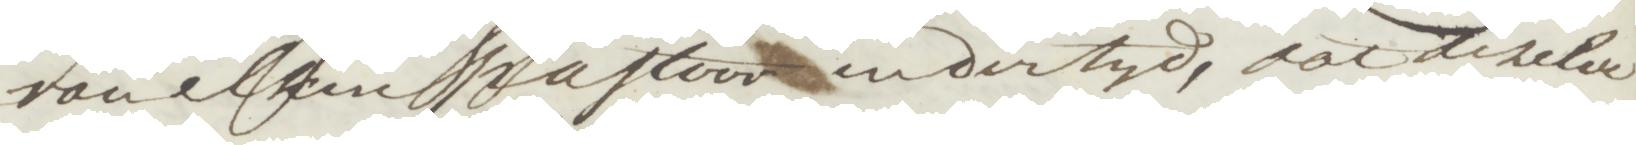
van elken pastoor in der tyd, dat dezelven
